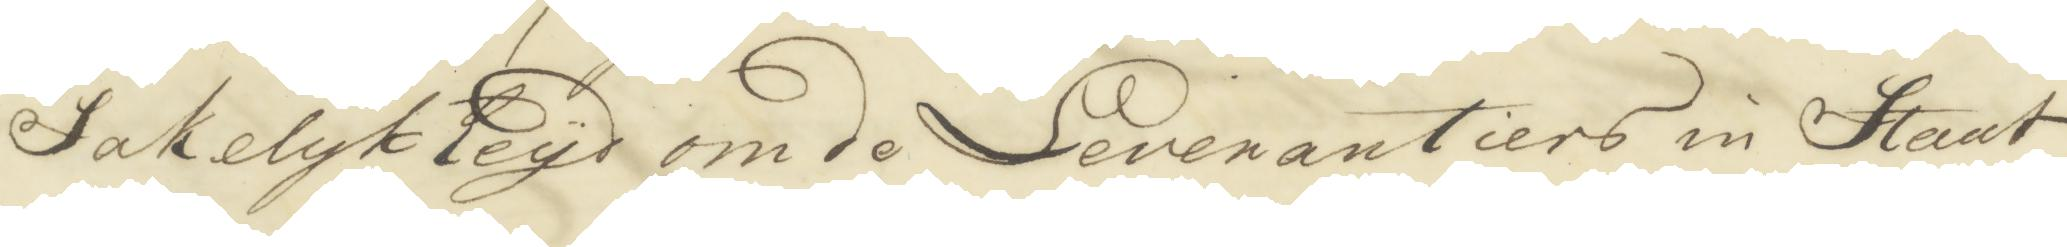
sakelijkheijd om de Leverantiers in staat
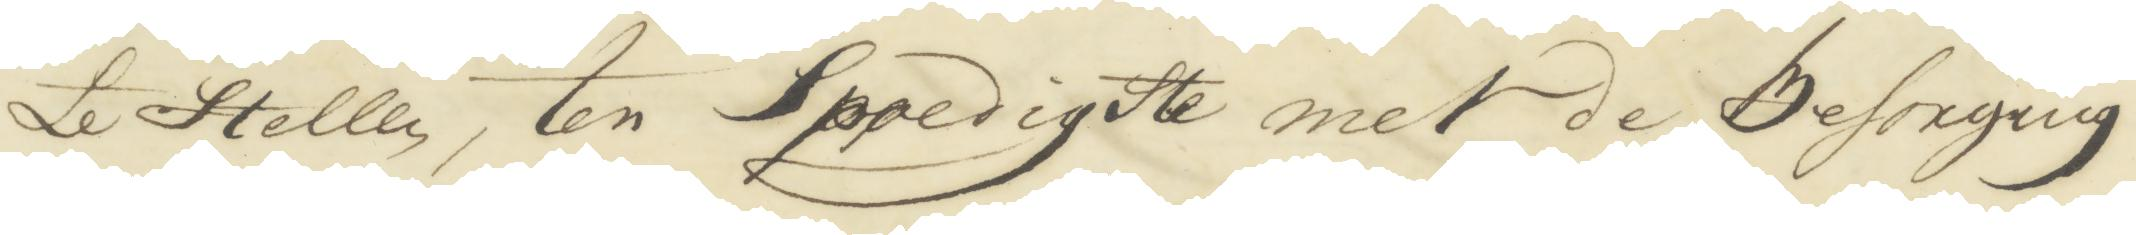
te stellen, ten spoedigste met de Besorging
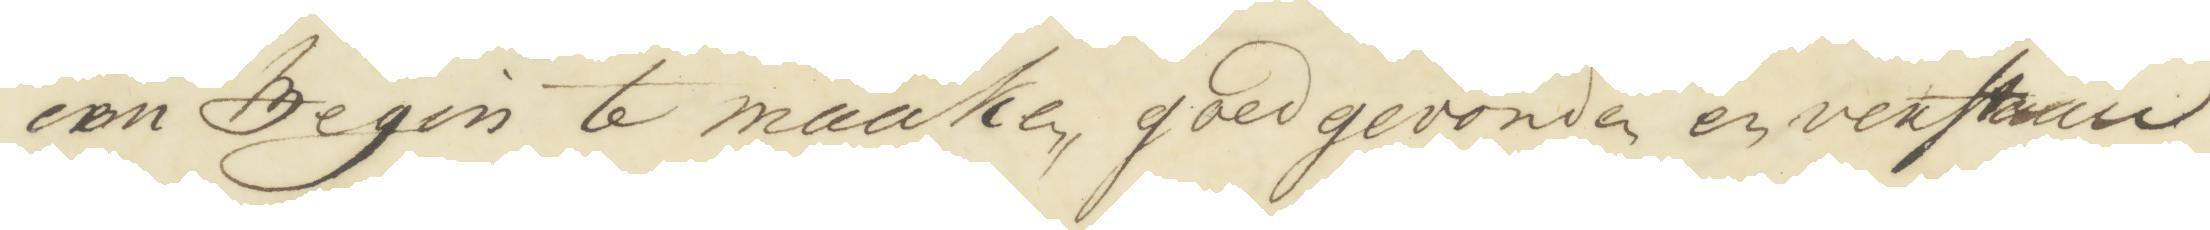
een Begin te maaken, goed gevonden en verstaan
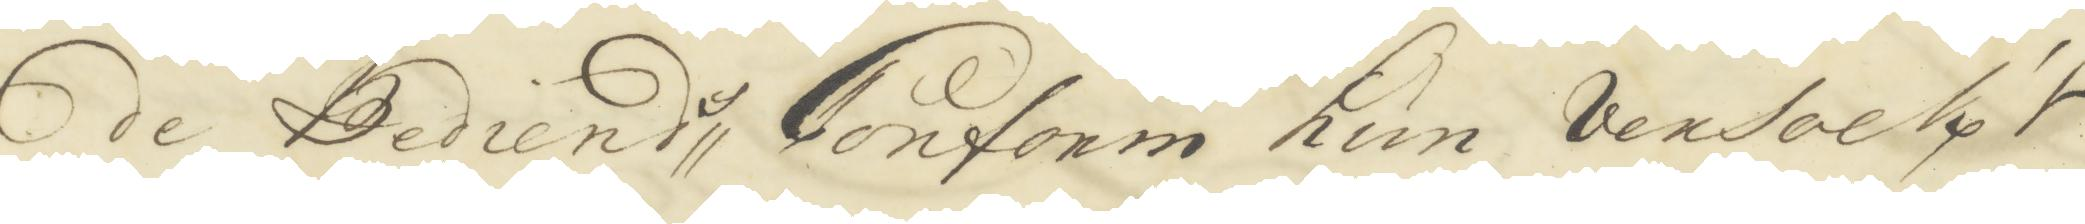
de Bediend„s Conform hun versoek 't
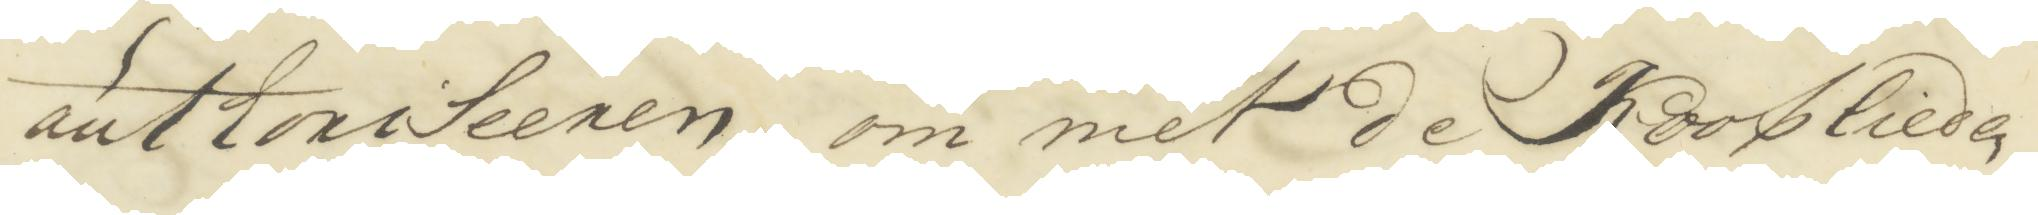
authoriseeren, om met de Kooplieden
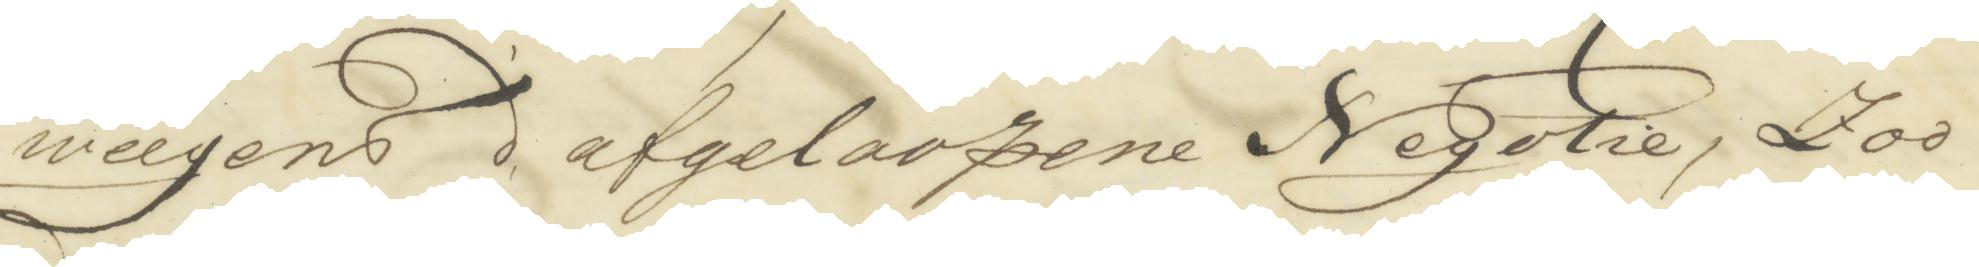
weegens d' afgeloopene Negotie, zoo
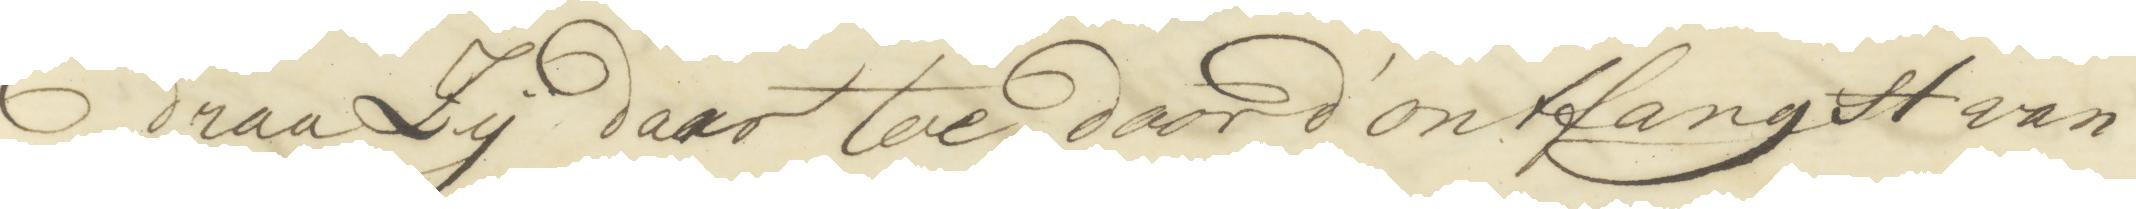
draa zij daar toe door d’ ontfangst van
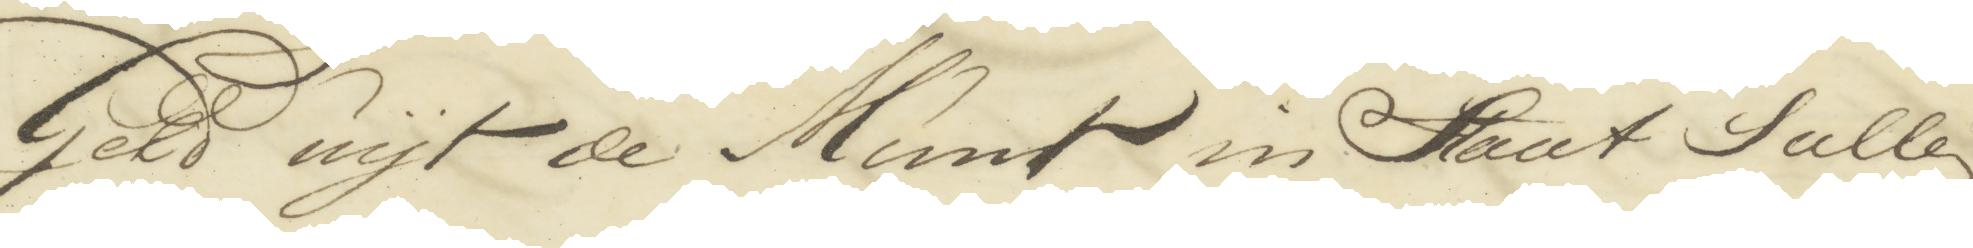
Geld uijt de Munt in staat sullen
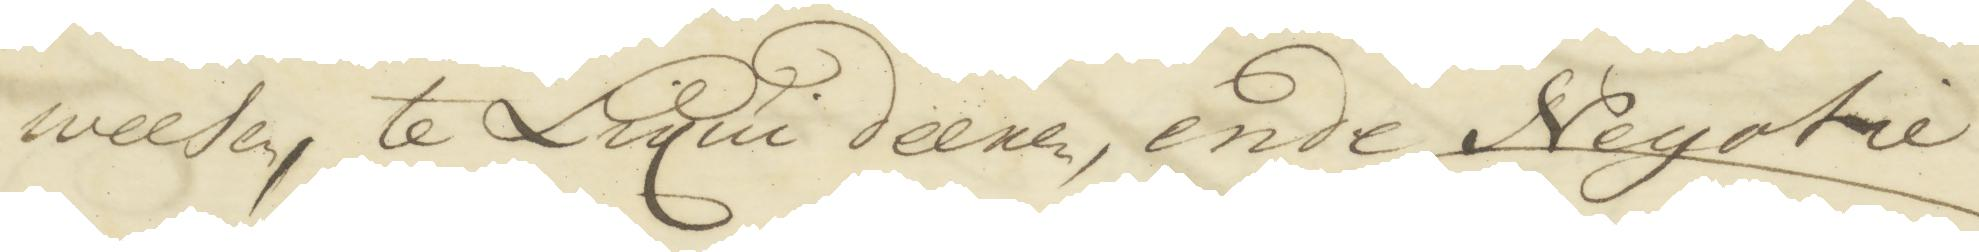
weesen, te Liqui deeren, ende Negotie
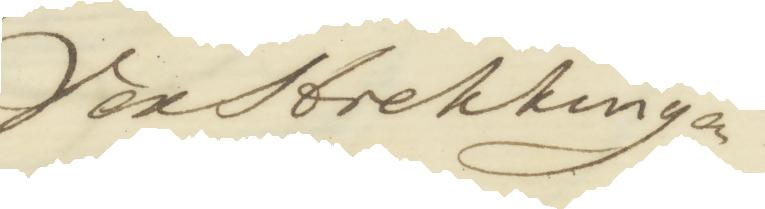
Verstrekkingen
